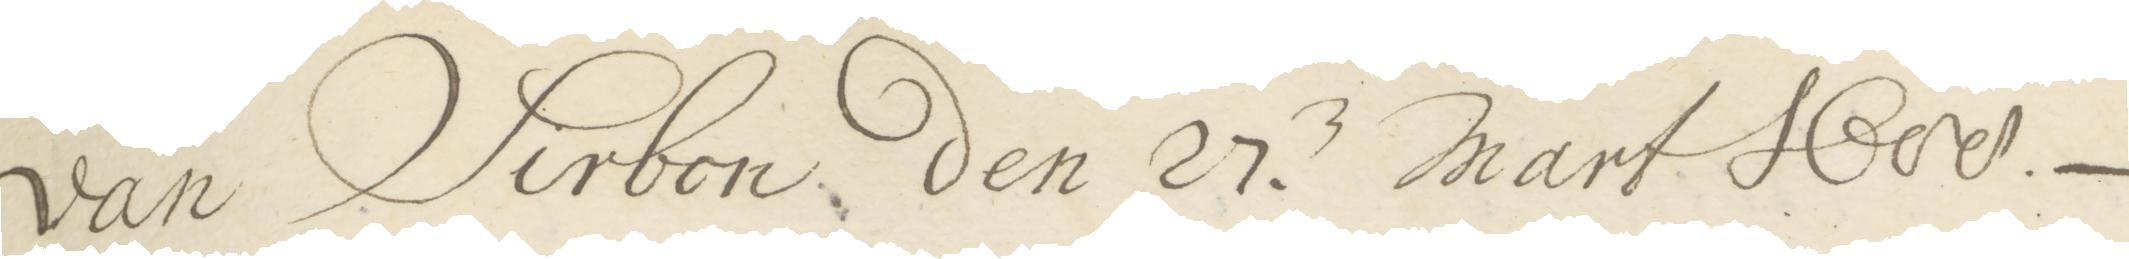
Van Sirbon den 27„en Mart 1688. —
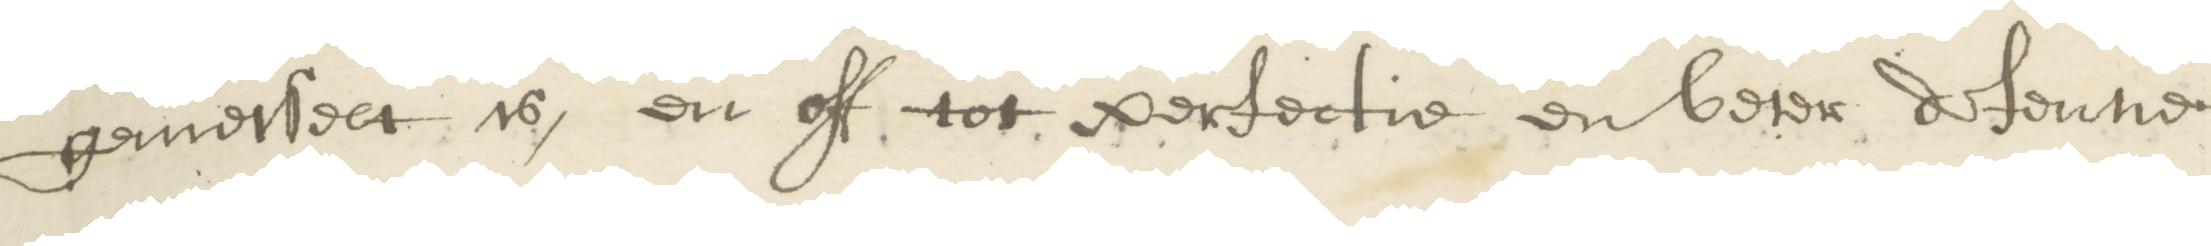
gemetselt is, en off tot perfectie en beter defentie
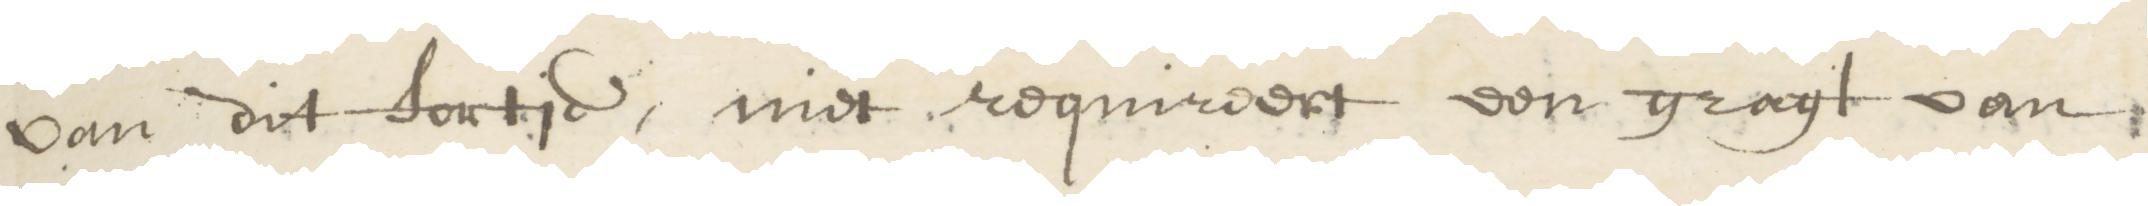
van dit fortje, niet requireert een gragt van
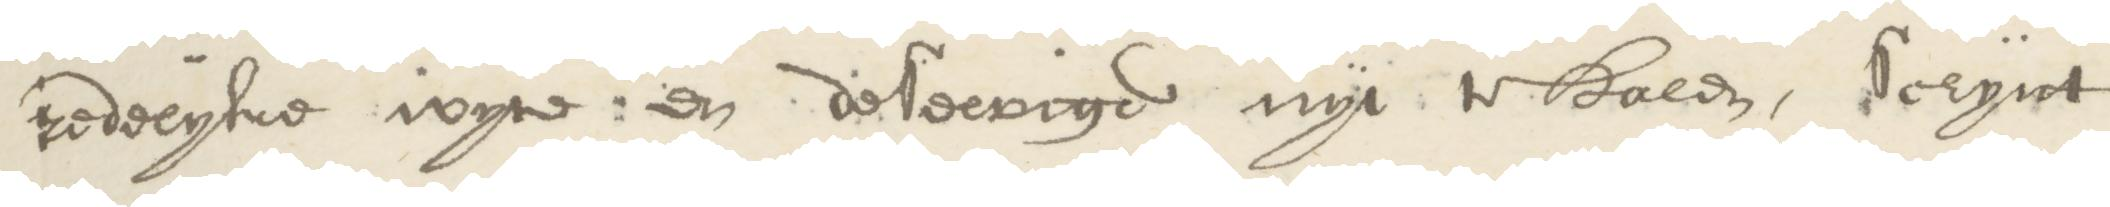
redelijke wijte en deselvige uijt te halen, schijnt
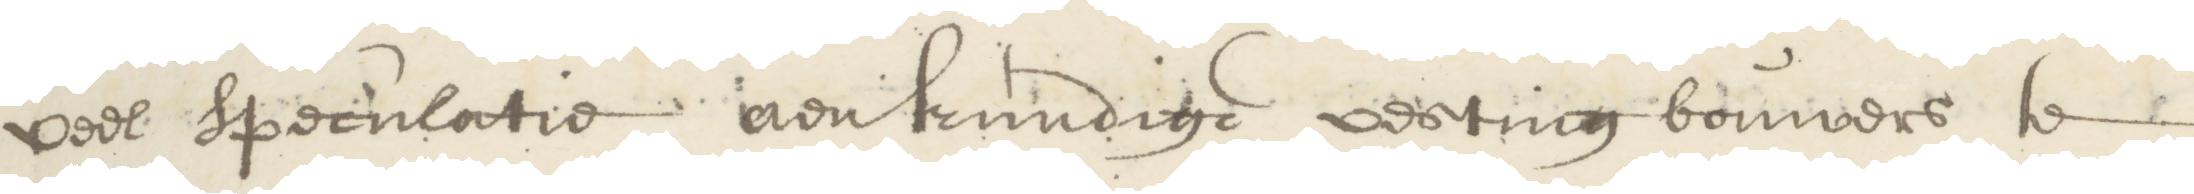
veel speculatie aenkundige vesting bouwers te
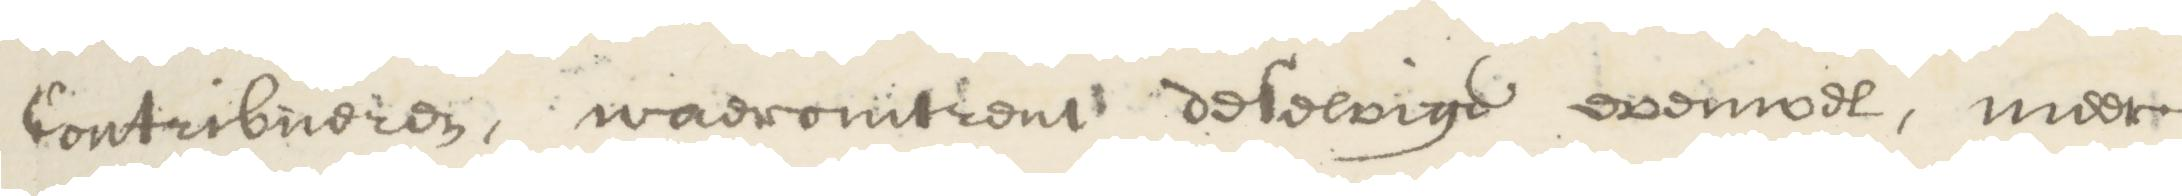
contribueren, waeromtrent deselvige evenwel, meer
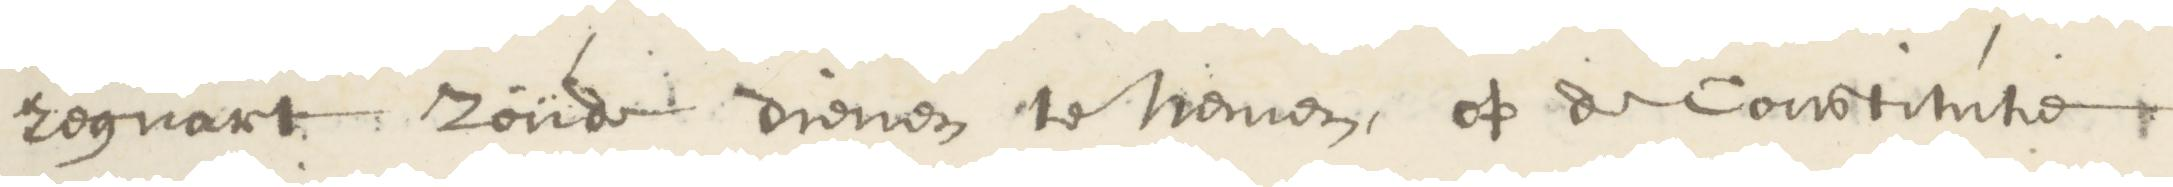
reguart zoude dienen te nemen, op de constitutie
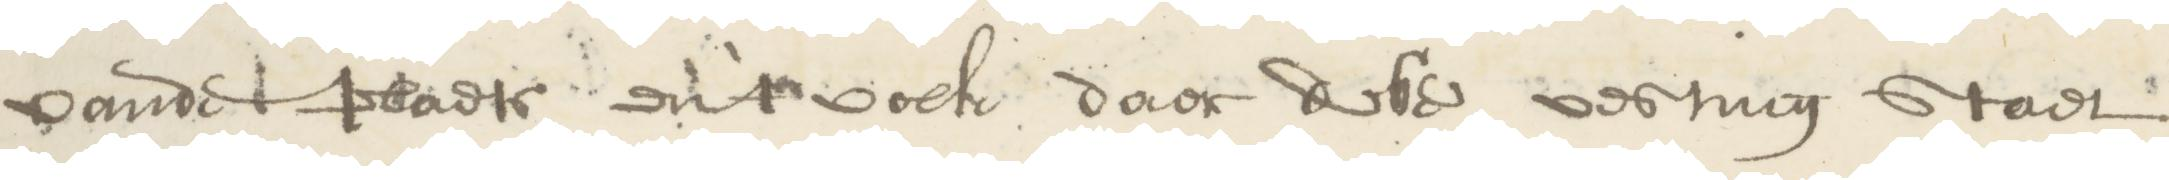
vande plaets en 't volk daer dese vesting staet
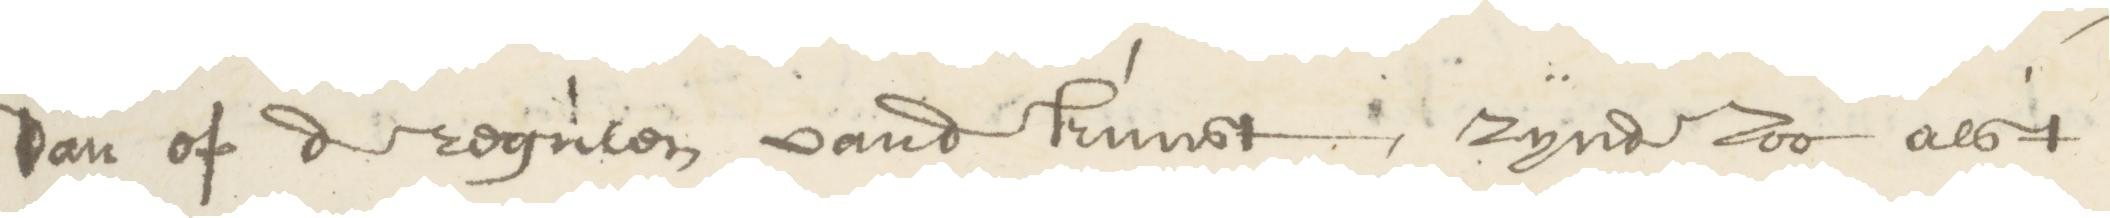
dan op de regulen vandekunst, zijnde zoo als’t
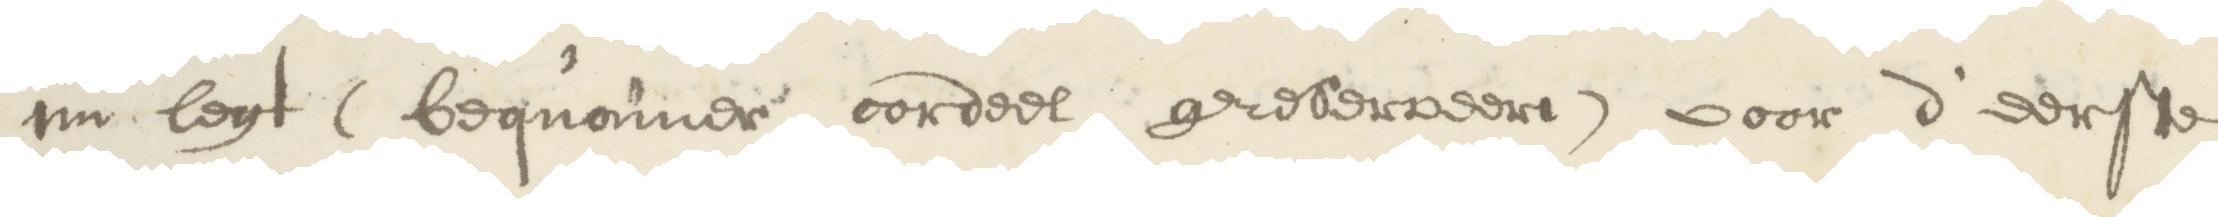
nu legt (bequamer oordeel gereserveert) voor d’ eerste
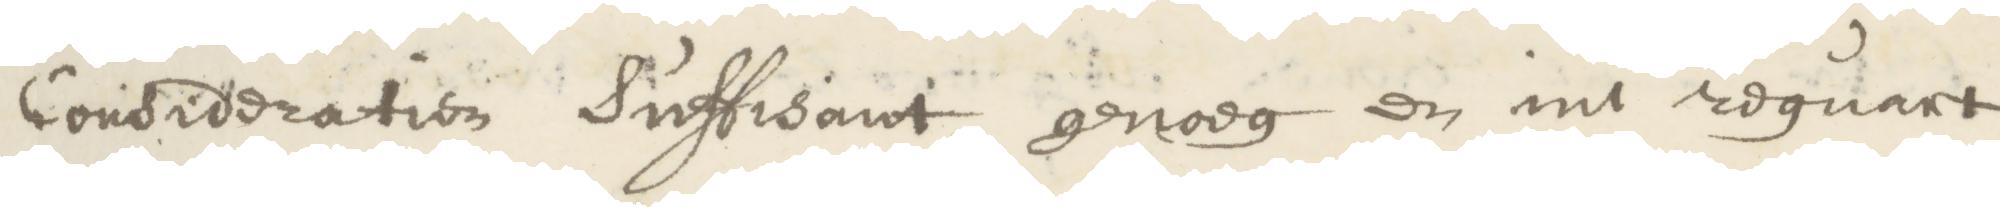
consideratien suffisant genoeg en in't reguart
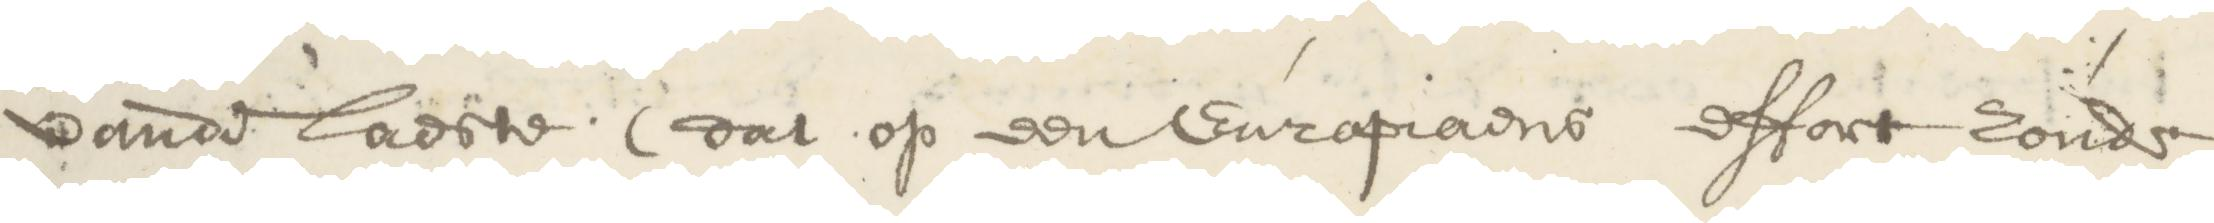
vande laeste (dat op een Europiaens effort zoude
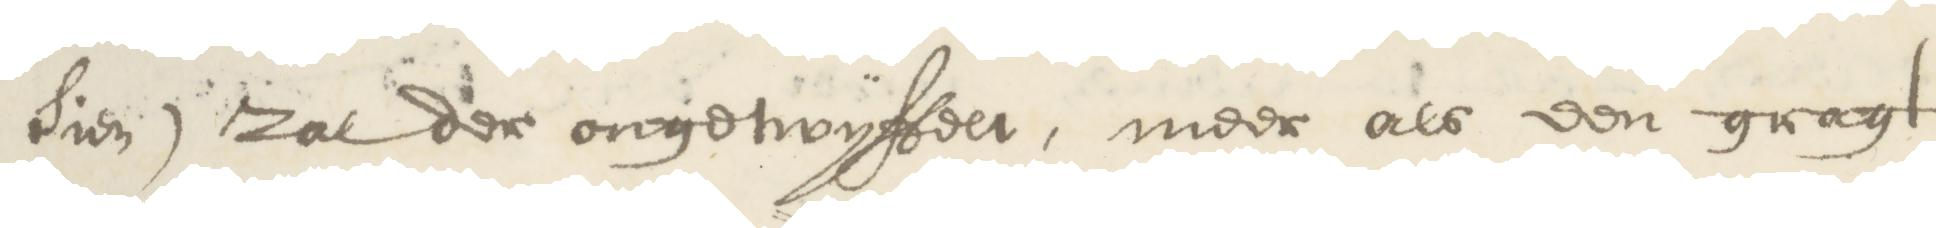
sien) zal der ongetwijffelt, meer als een gragt
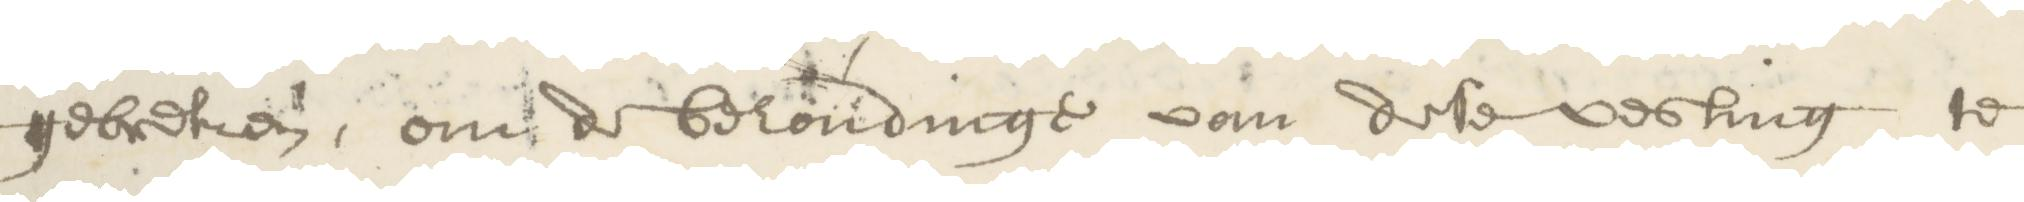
gebreken, om de behoudinge van dese vesting te
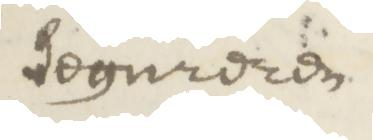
segureren
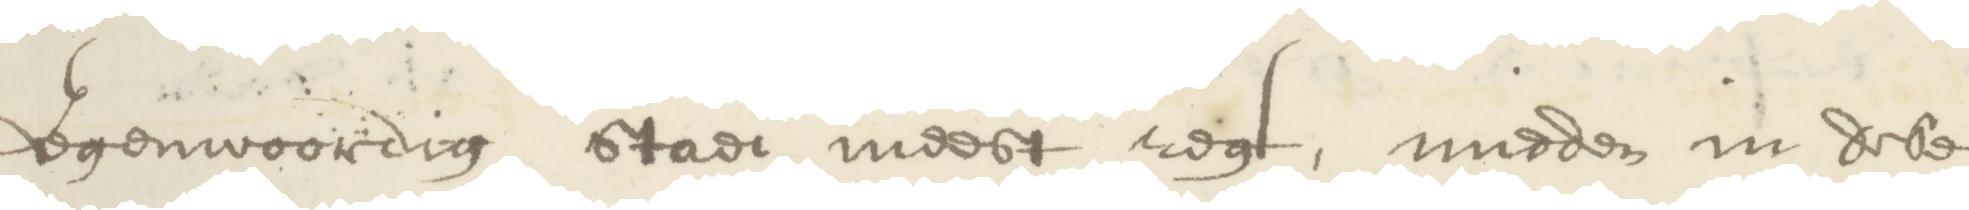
Tegenwoordig staet meest regt, midden in dese
